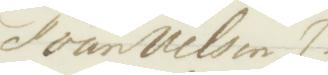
F van Velsen J
